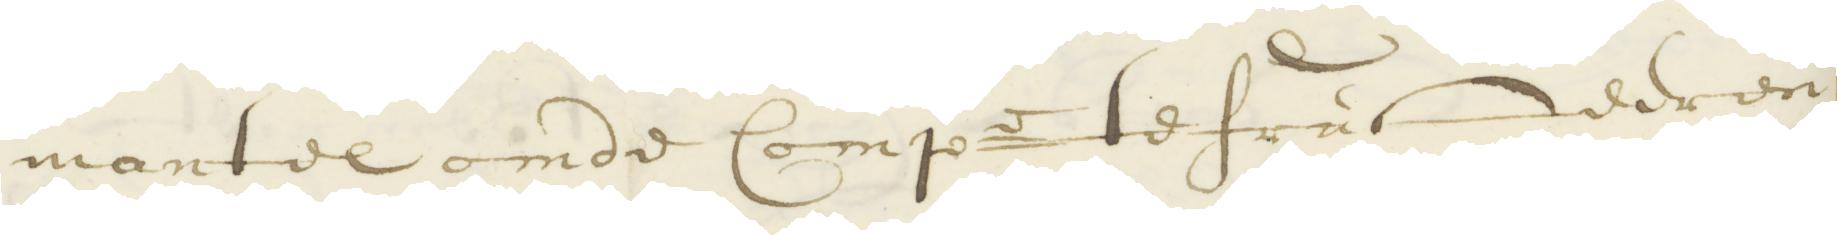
mantel omde Comp=e te frusteeren
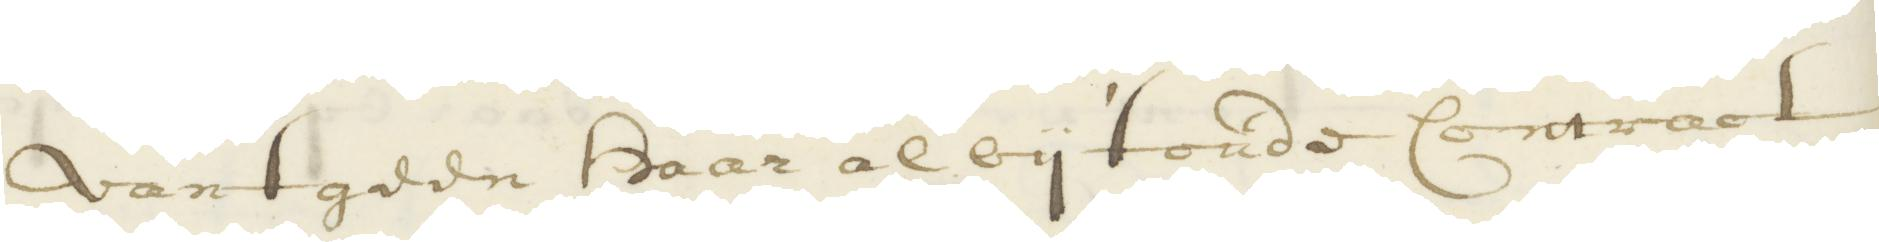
van't geen haar al bij ’t oude Contract
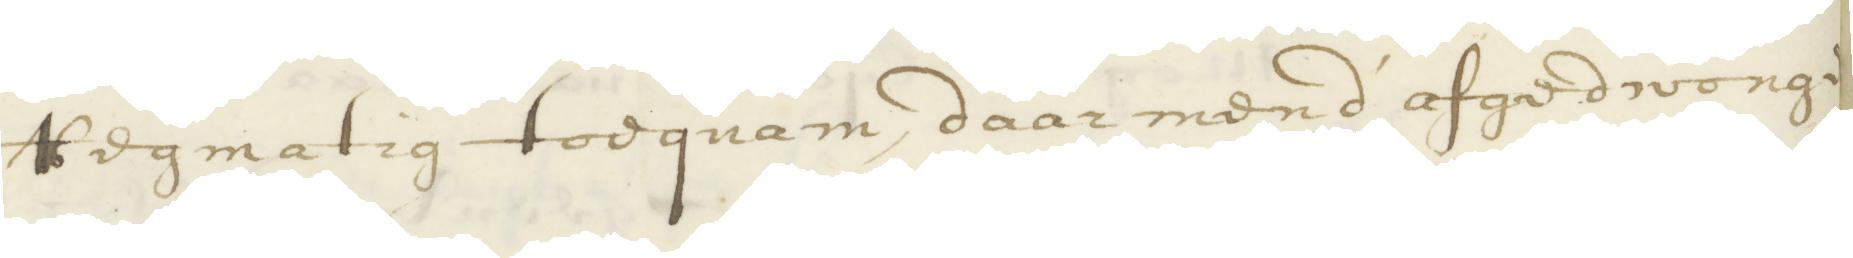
Regmatig toequam, daar men d’ afgedwonge
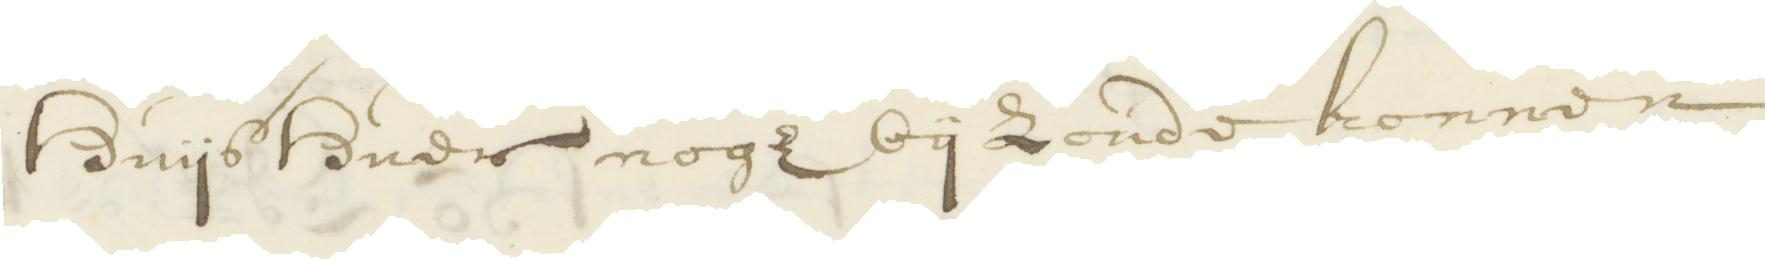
huijs huer nogh bij zoude konnen
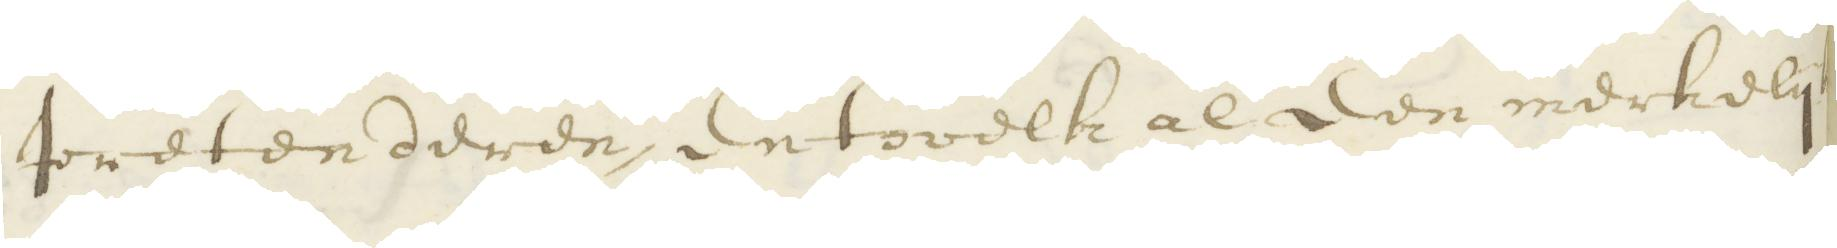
pretenderen, en twelk al een merkelij
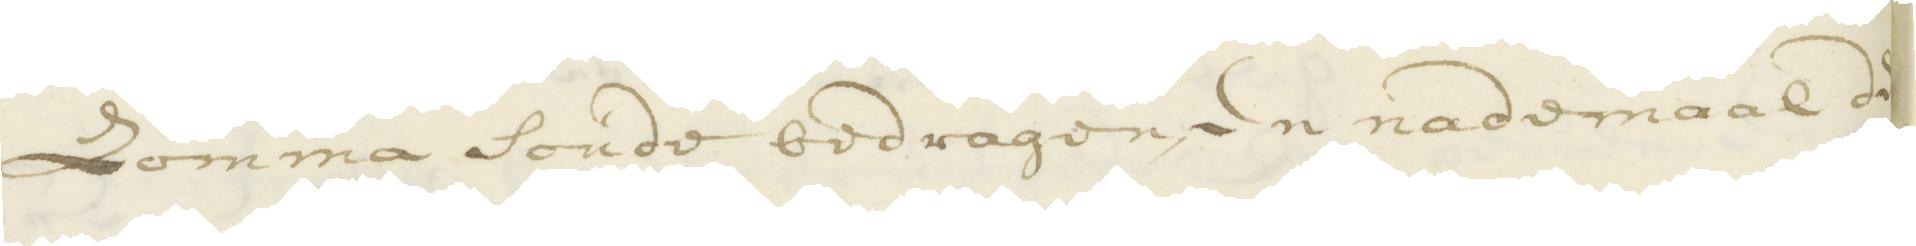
Zomma soude bedragen, En nademaal de
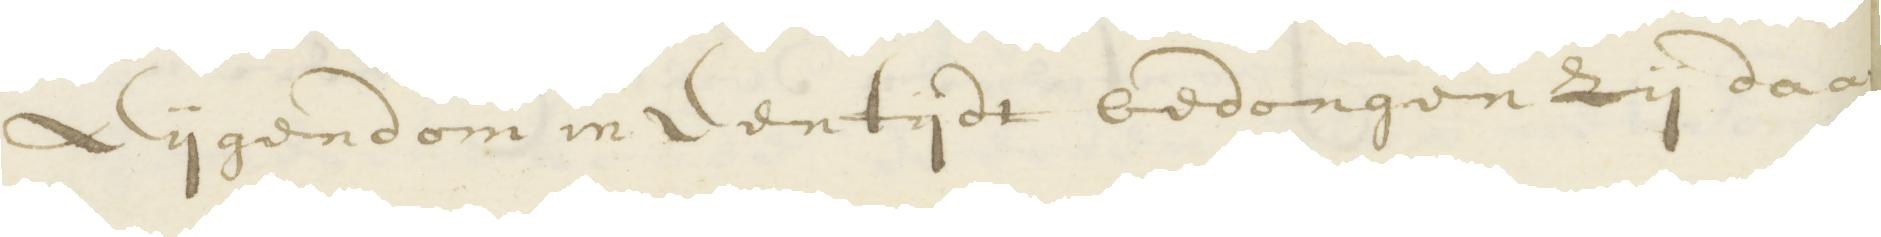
Eijgendom in Eentijdt bedongen zij daa
